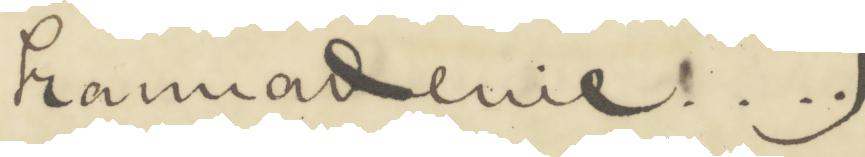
kannadenil....
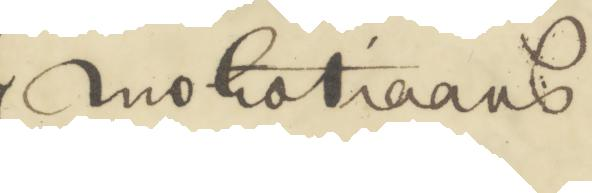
mohotiaars
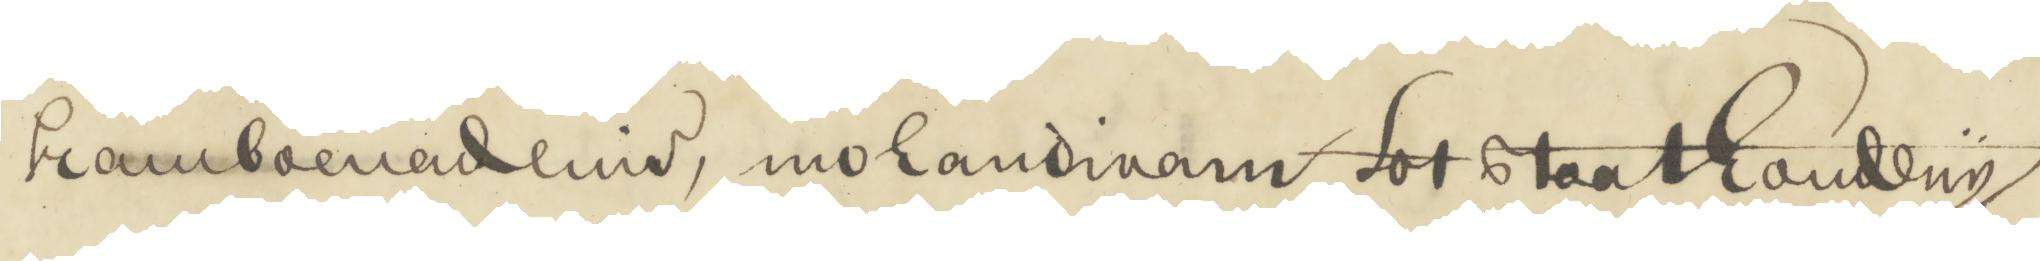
kamboenadenie, mohandiram tot staathoudenij
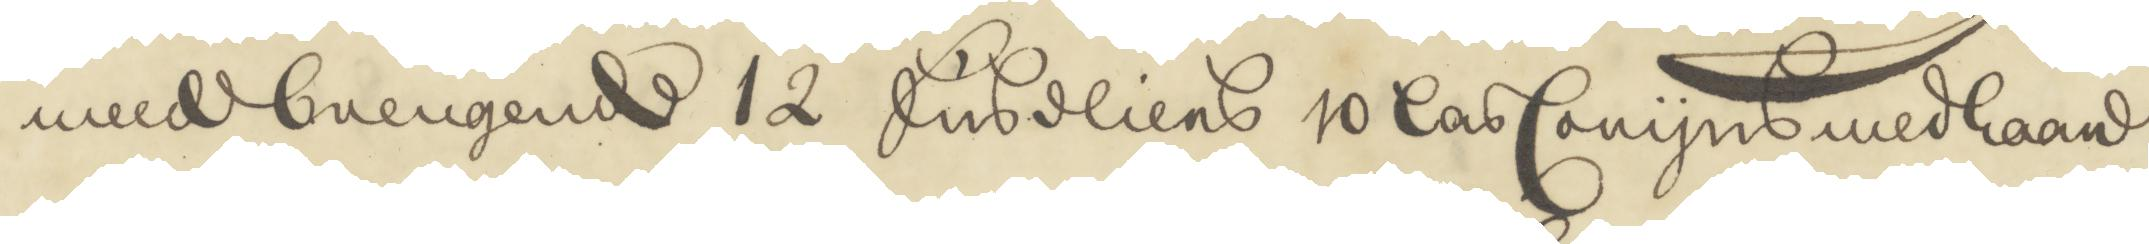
meede brengende 12 fuseliers 10 cascorijns med haar
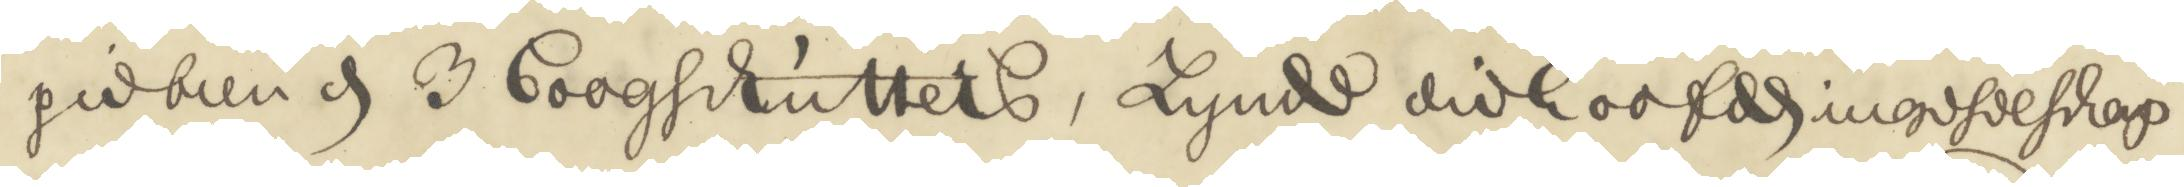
pieken en 3 boogschutters, Zynde die hoofden ingeselschap
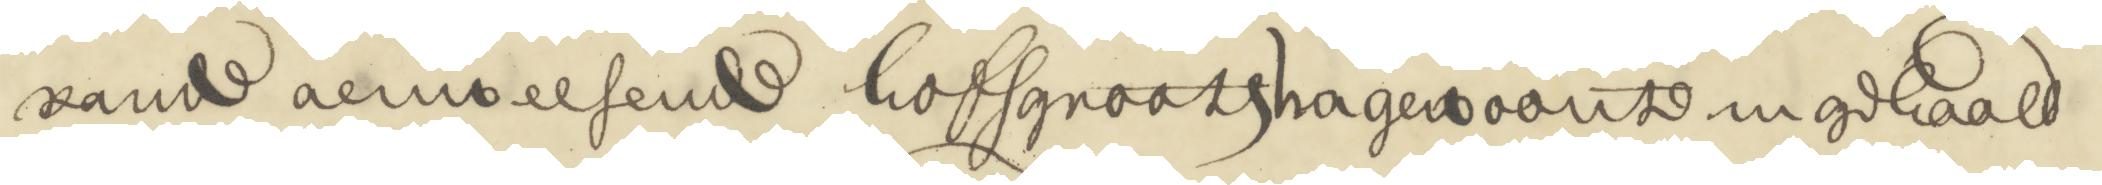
vande aenweesende hoffgrooten na gewoonte in gehaald
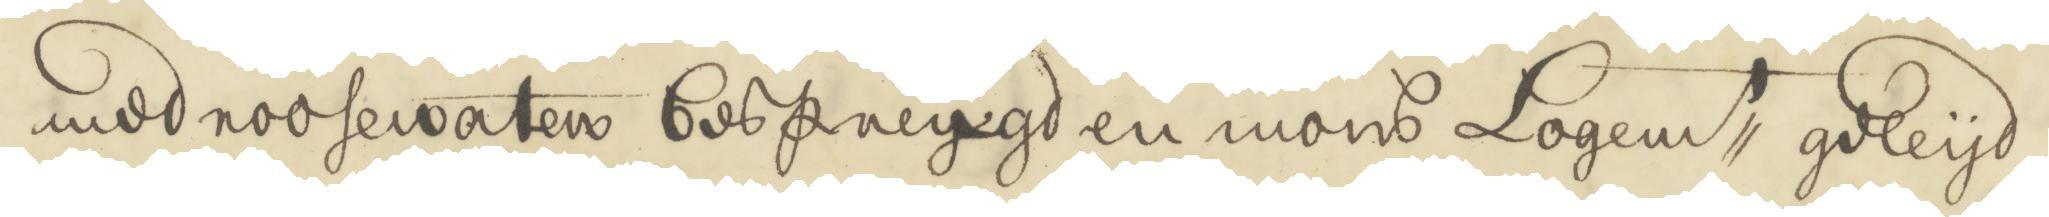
med roosewater bespreygd en in ons Logem„t geleijd
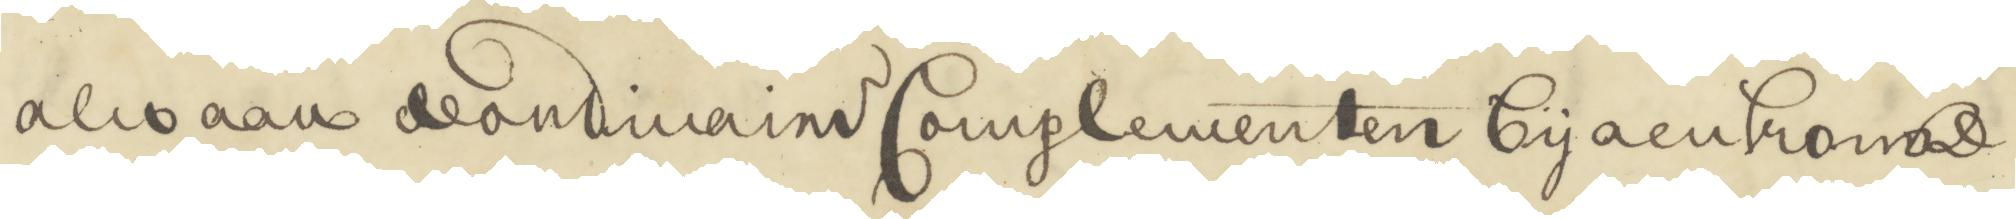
alwaar de ordinaire Complementen bij aenkomste
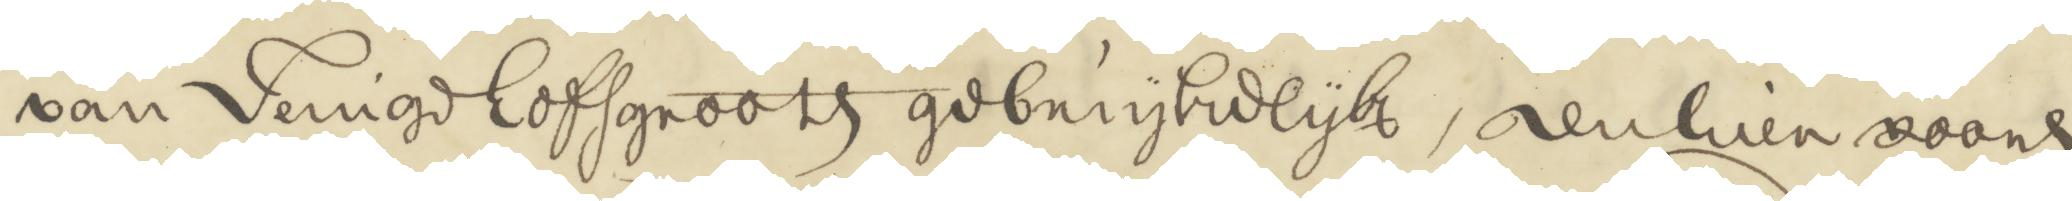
van Eenige hoffgrooten gebruijkelijk, en hier vooren
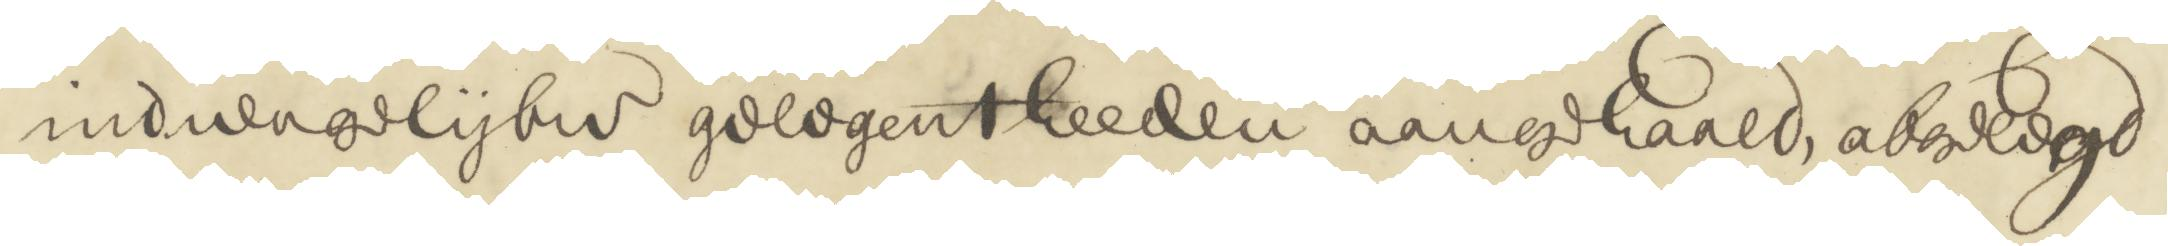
indiergelijke gelegentheeden aangehaald, afgelegd
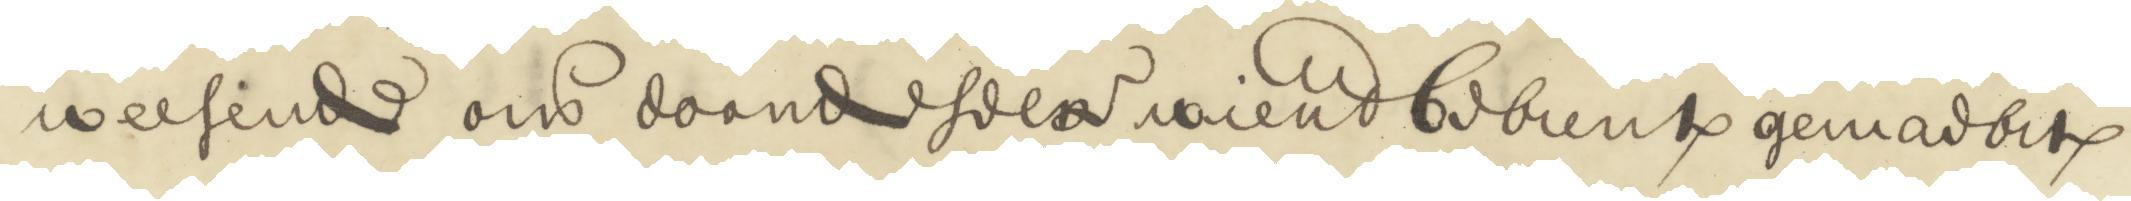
weesende ons door deselve wierd bekent gemaekt
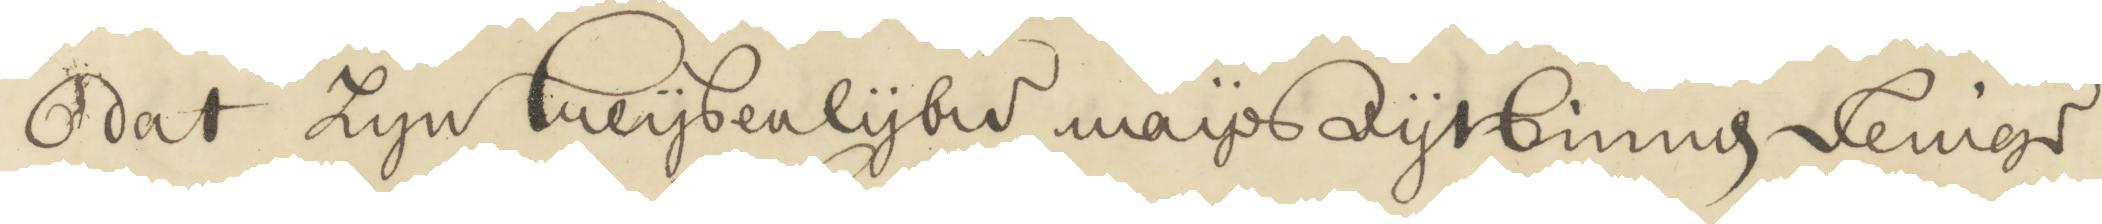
dat Zyn keijserlijke maijestijt binnen Eenige
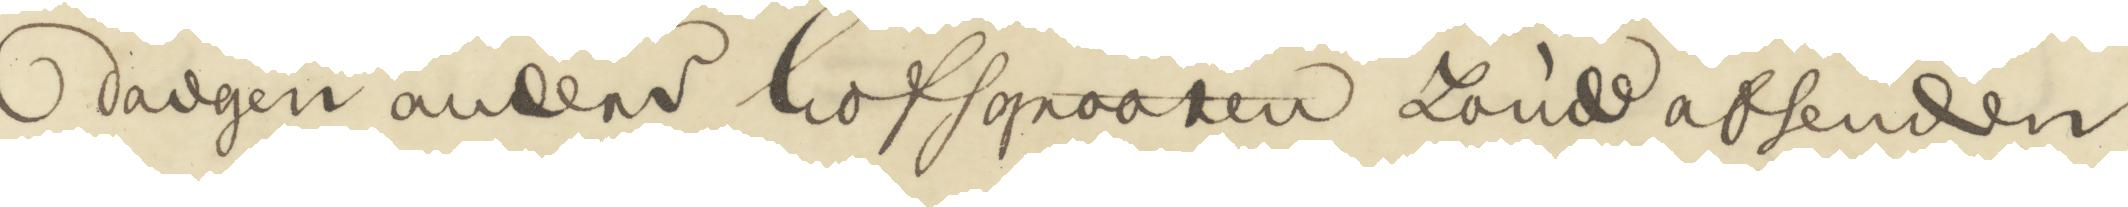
daegen andere hoffgrooten Zoude afsenden
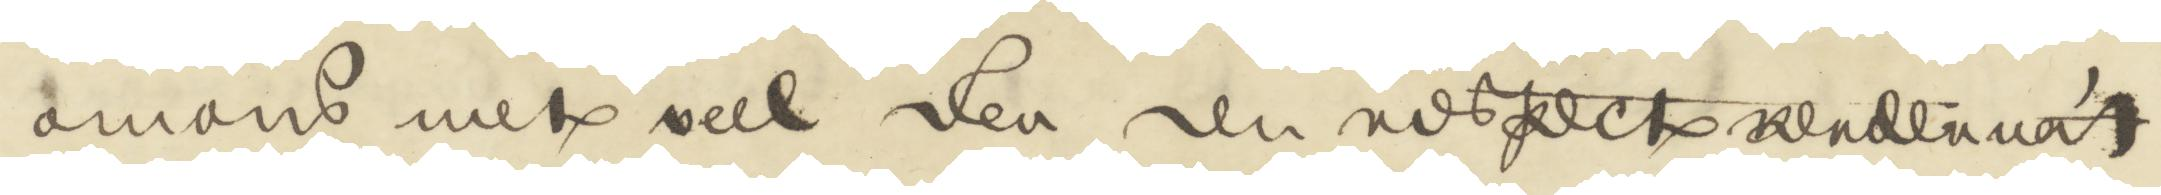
om ons met veel Eer en respect verder na't
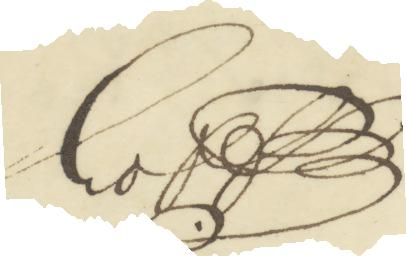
hoff
